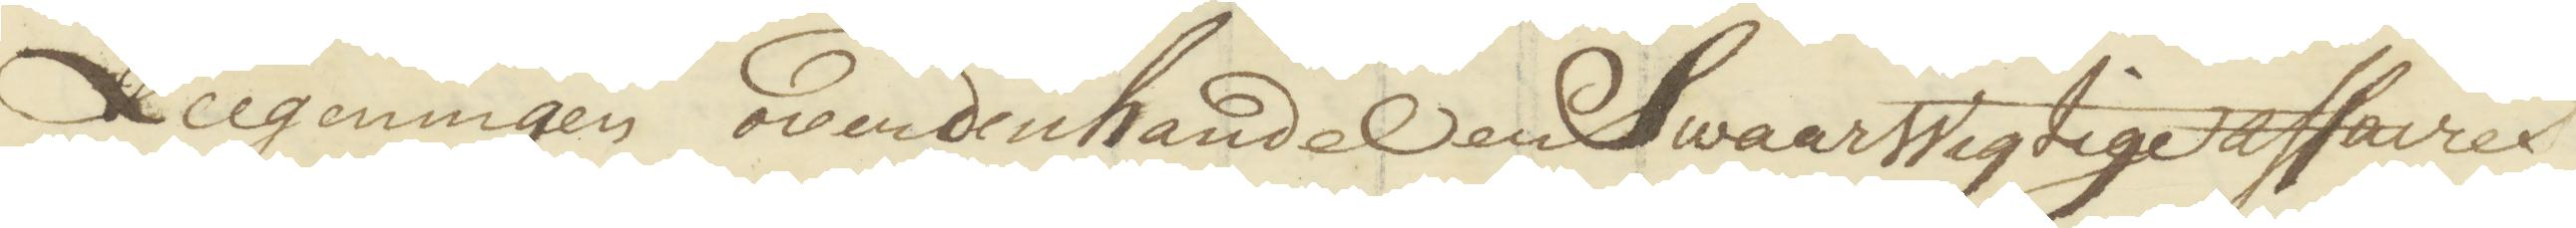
zeegeningen over den handel en Swaarwigtige affaires
